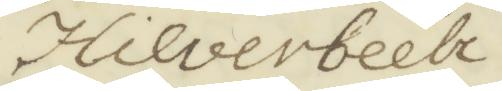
Hilverbeek
